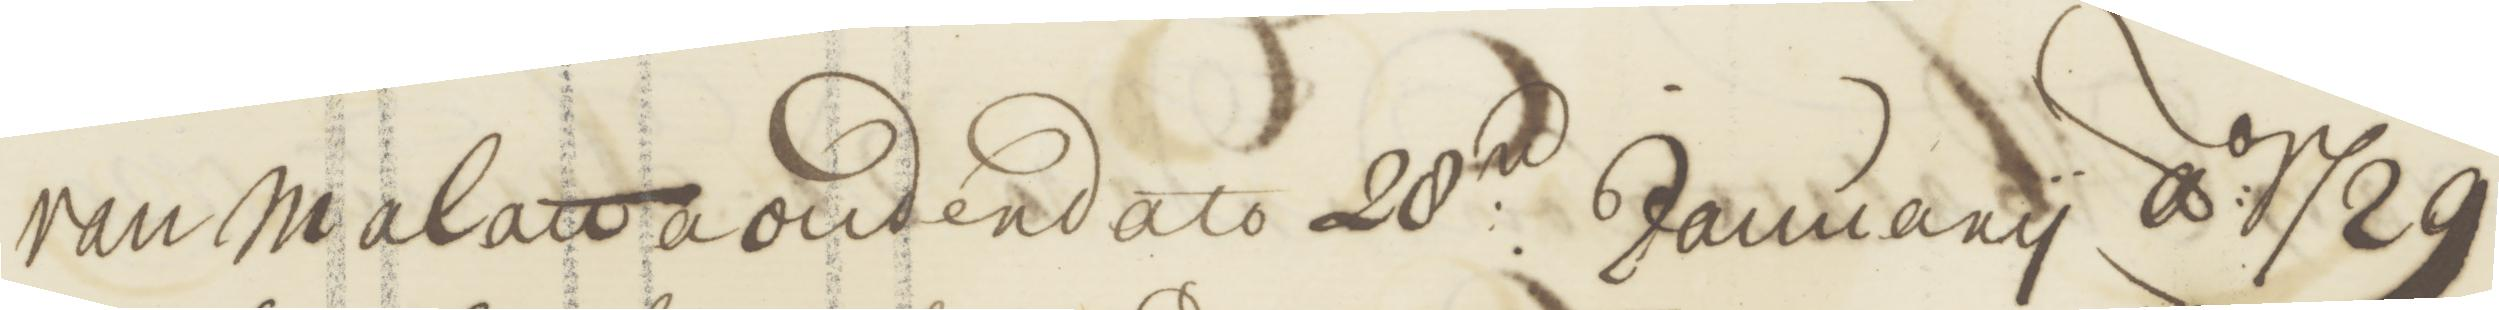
van Malacca onder dato 28:n Januarij a:o 1729
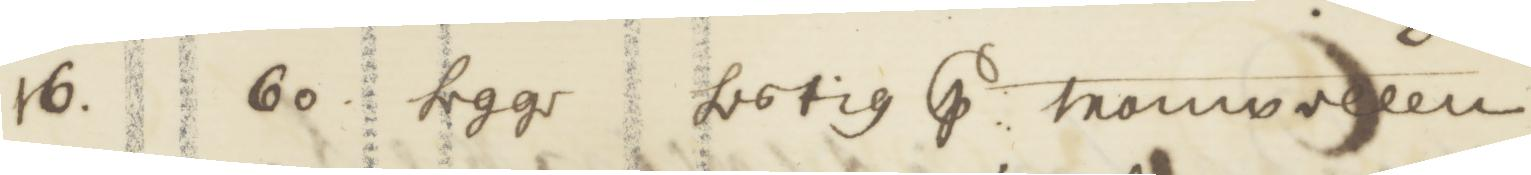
16. 60. segge sestig p:s tromvellen
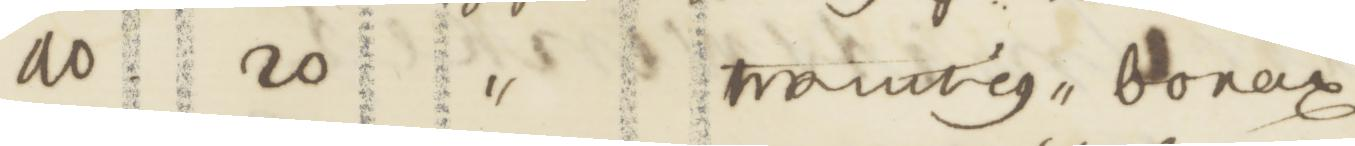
40 20 „ twintig „ borax
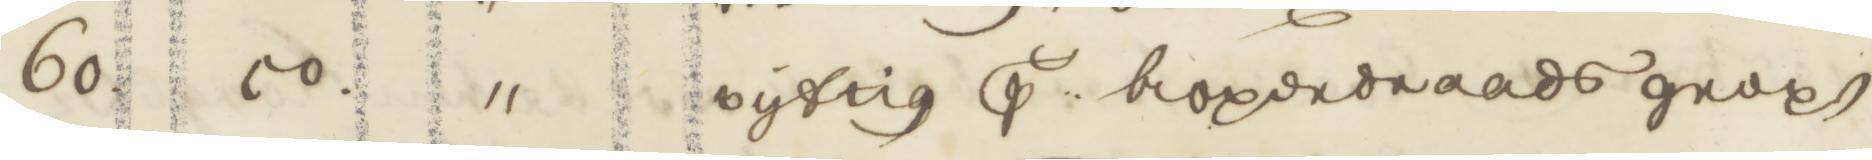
60. 50. „ vijftig p:s koperdraads grepen
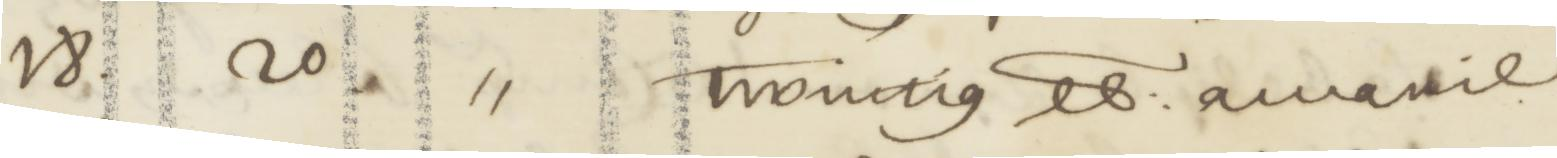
18. 20 „ twintig lb: amaril
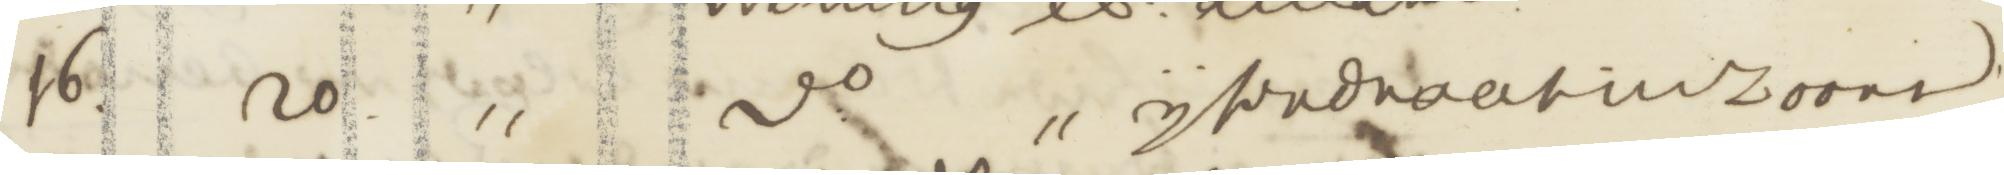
16. 20 „ d:o „ ijserdraat in zoort
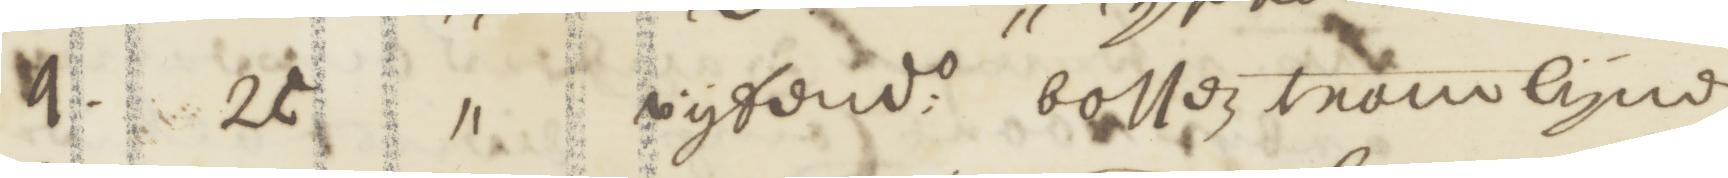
4. 25 „ vijf en d:o bossen tromlijnen
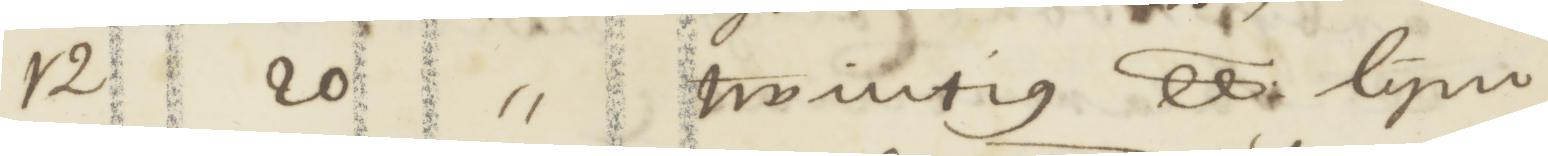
12 20 „ twintig lb:lijm
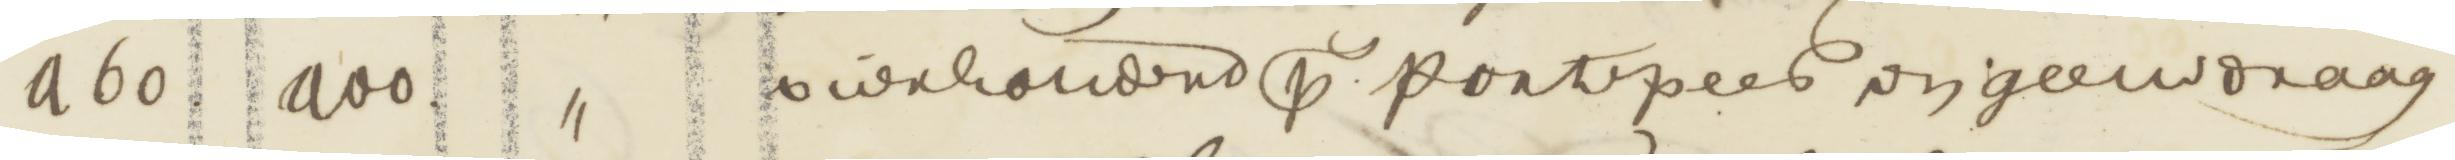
460. 400. „ vierhonderd p.s portepees en geensdraag
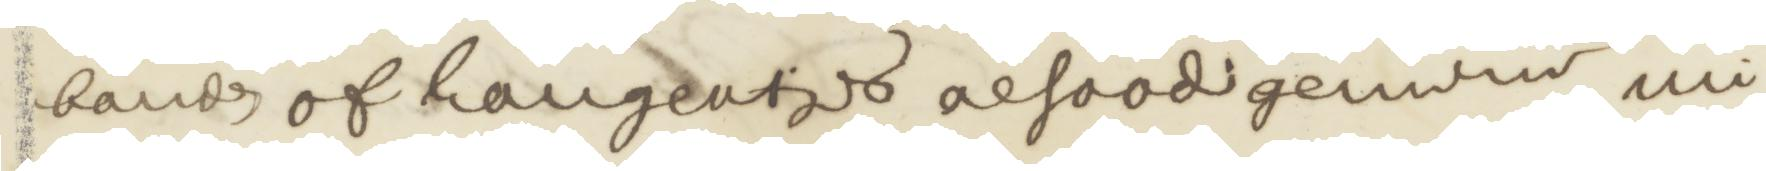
banden of hangertjes alsoo de gemene mi
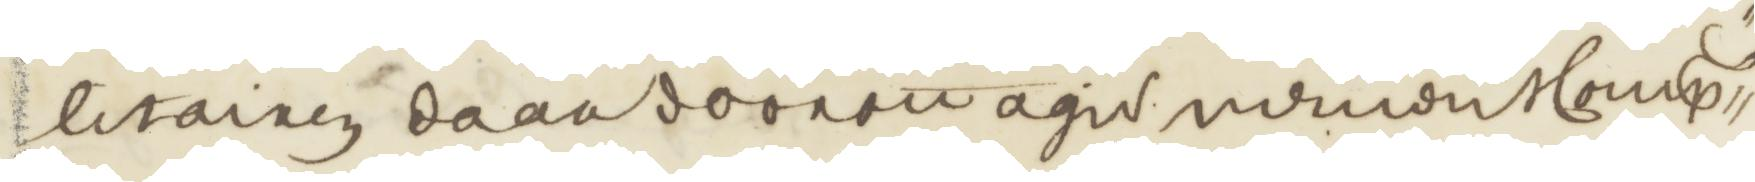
litairen daar door occagie nemen 'sComp„s
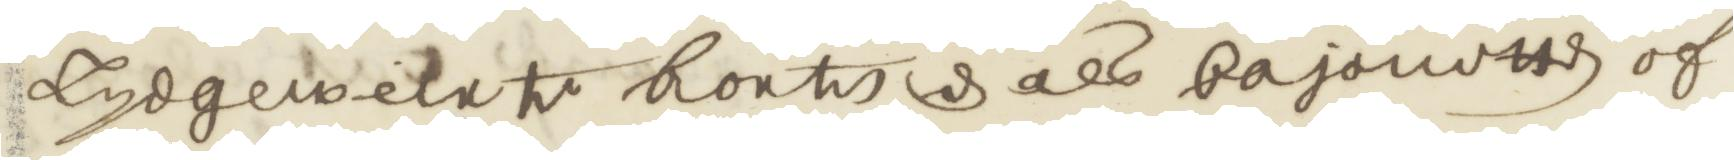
zyd gewelk te korten ende als bajonetten of
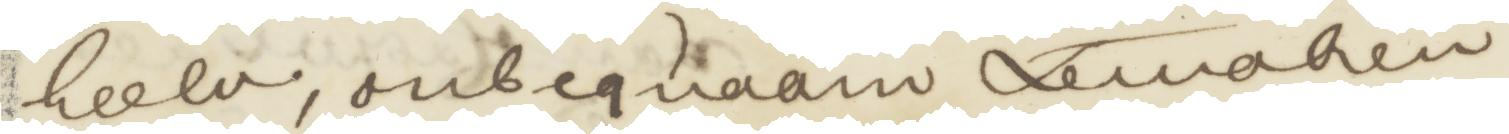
heele, onbequaam te maken
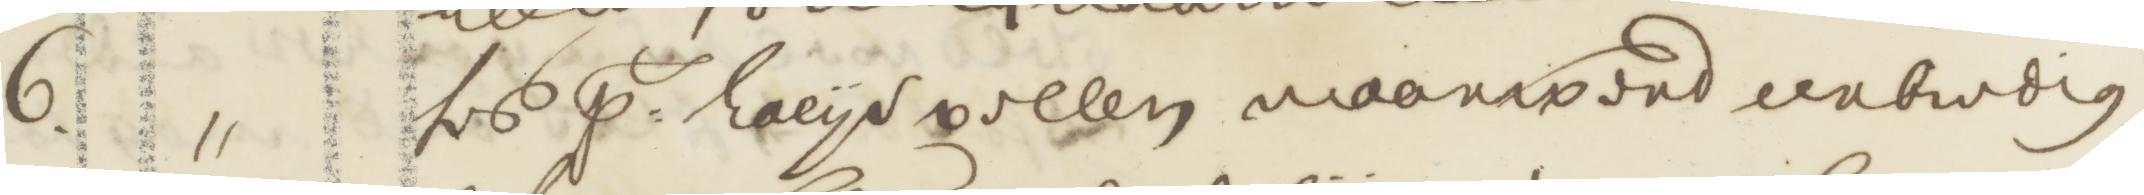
6. „ ses p:s halije vellen maar werd eerbiedig
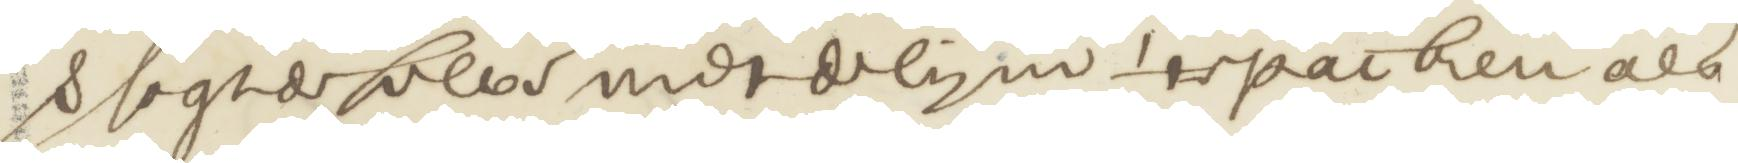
versogt deselve met de lijm 'te packen als
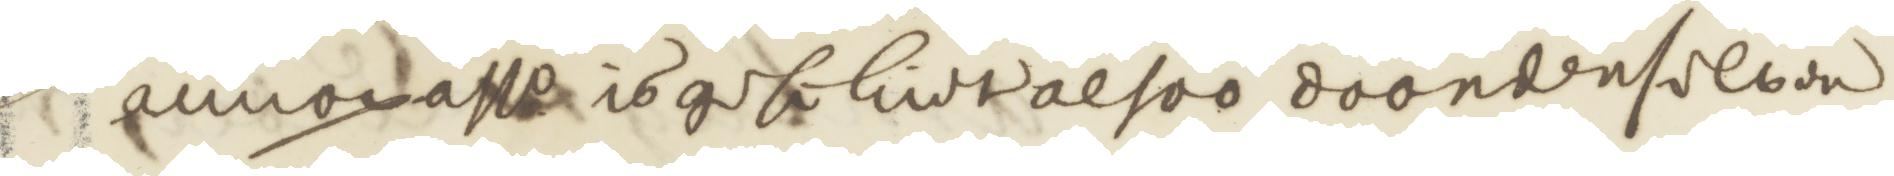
anno passo is geschiet alsoo door denselven
